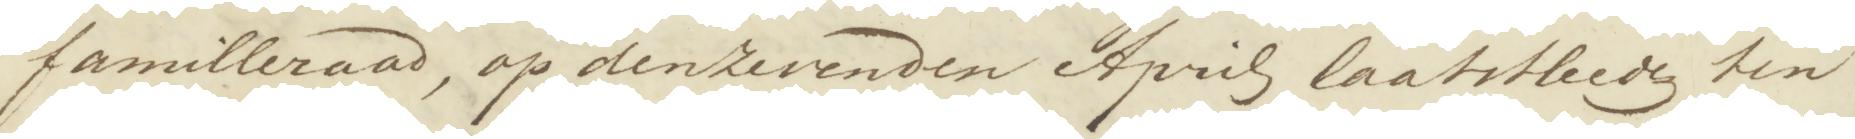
familleraad, op den zevenden April laatstleeden ten
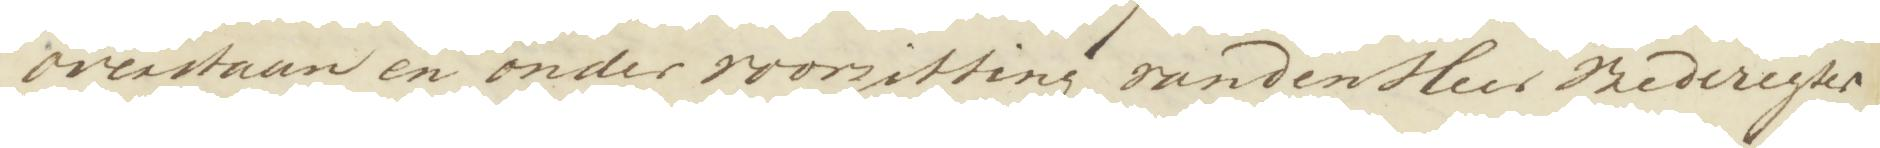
overstaan en onder voorzitting van den Heer Vrederegter
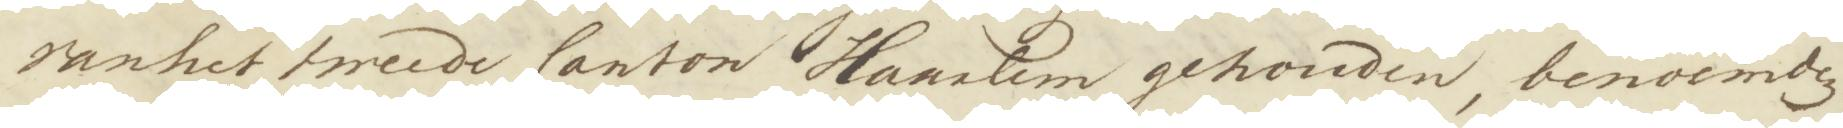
van het tweede Canton Haarlem gehouden, benoemden
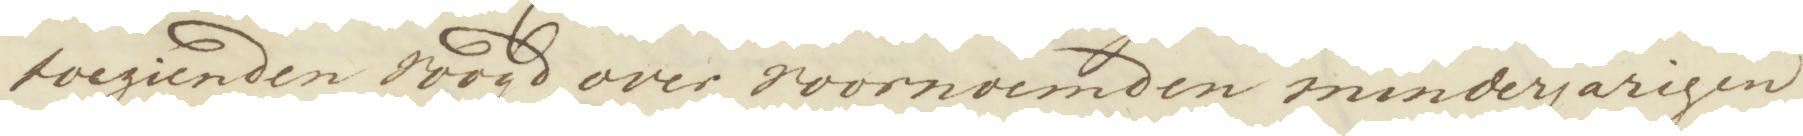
toezienden voogd over voornoemden minderjarigen
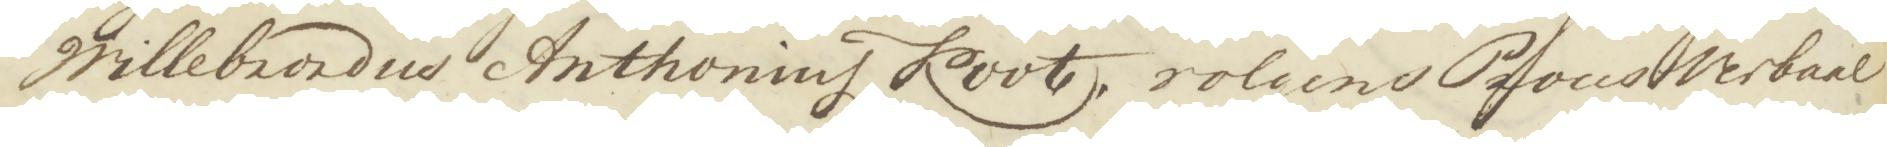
Willebrordus Anthonius Koot, volgens Proces Verbaal
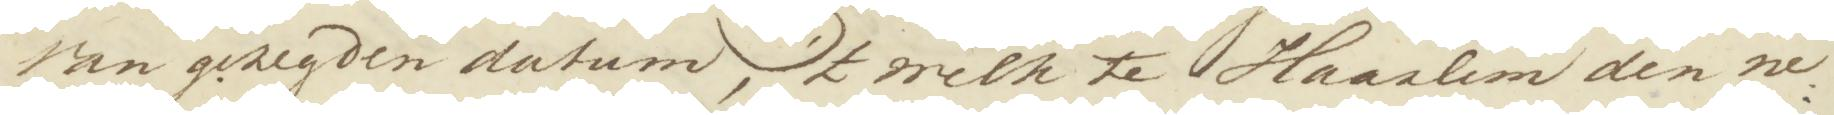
van gezegden datum, 't welk te Haarlem den ne„
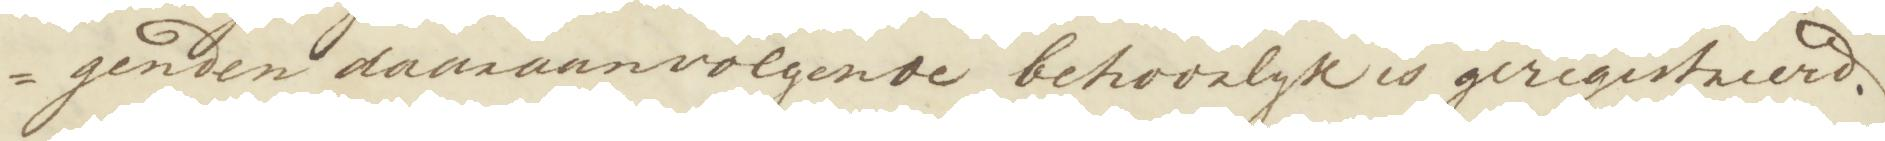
„genden daaraanvolgende behoorlyk is geregistreerd.
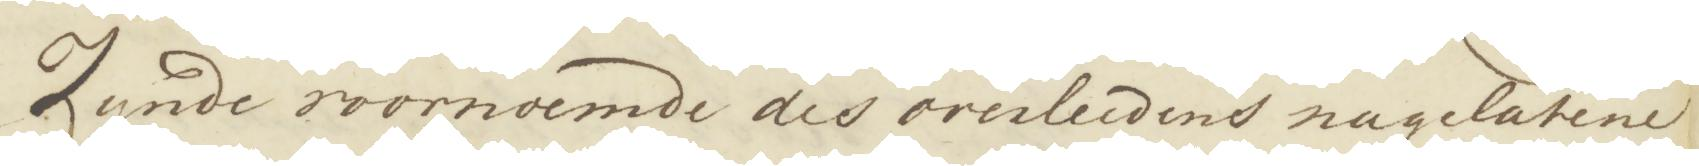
Zynde voornoemde des overleedens nagelatene
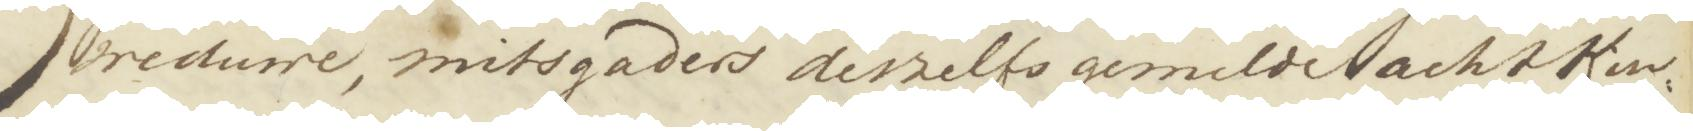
weduwe, mitsgaders deszelfs gemelde acht Kin„
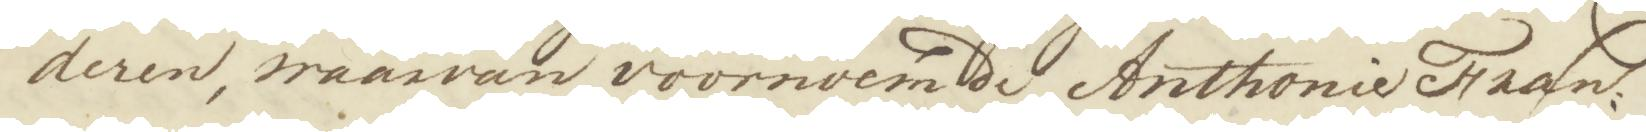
deren, waarvan voornoemde Anthonie Fran„
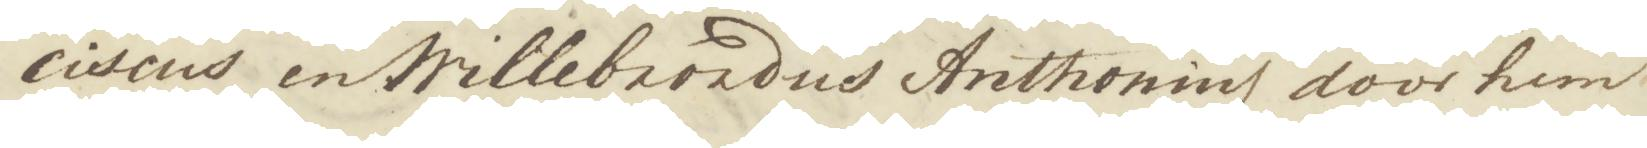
ciscus en Willebrordus Anthonius door hem
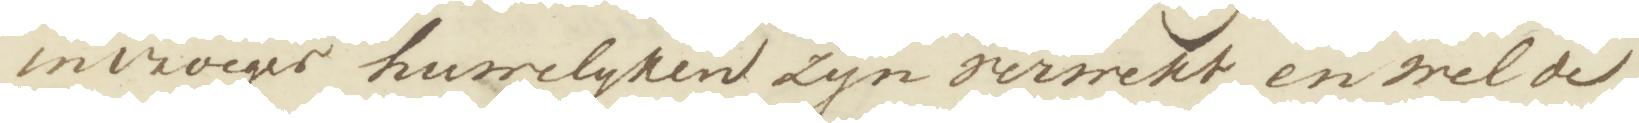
in vroeger huwelyken zyn verwekt, en wel de
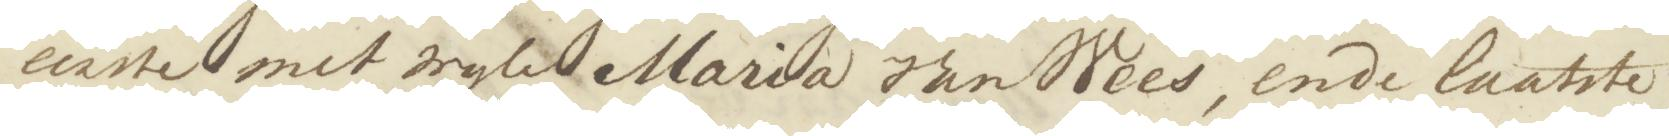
eerste met wyle Maria van Wees, ende laatste
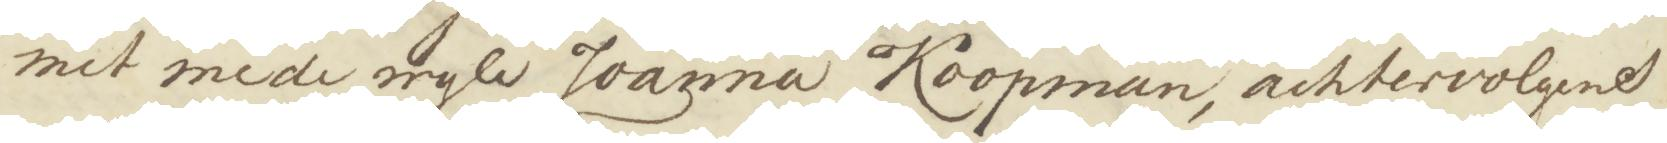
met mede wyle Joanna Koopman, achtervolgens
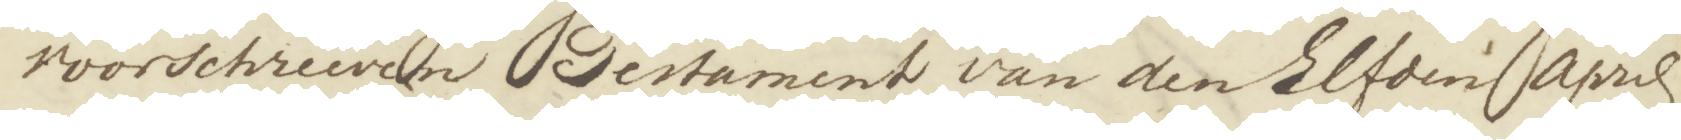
voorschreeven Testament van den Elfden April
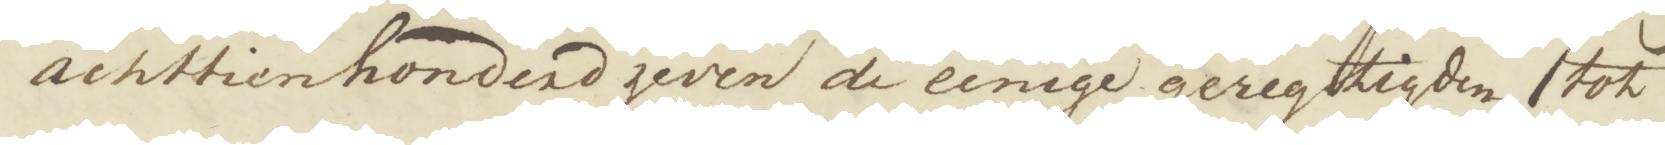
achttienhonderd zeven de eenige geregtigden tot
